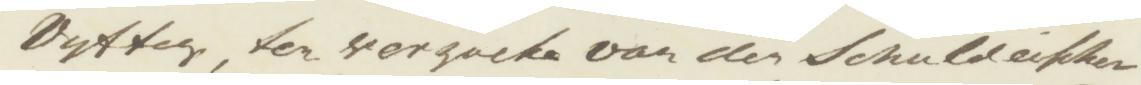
Vyftig ter verzoeke van den Schuldeischer
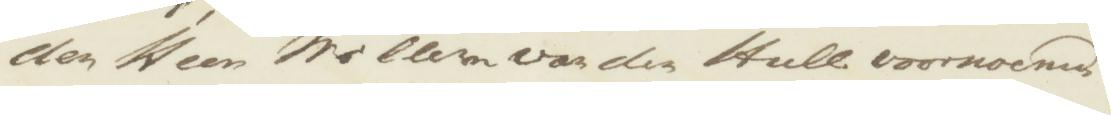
den Heer Willem van den Hull voornoemd.
